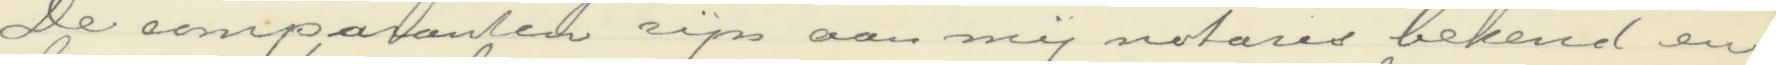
De comparanten zijn aan mij notaris bekend en
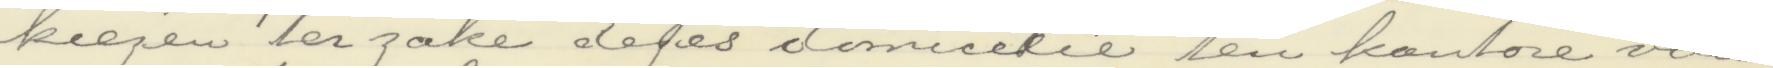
kiezen ter zake dezes domicilie ten kantore van
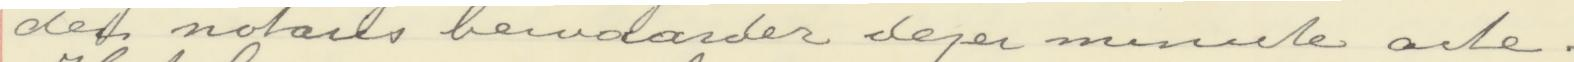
de notaris bewaarder dezer minute acte
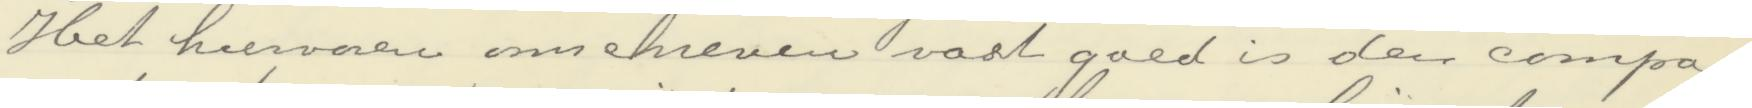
Het hiervoren omschreven vast goed is den compa
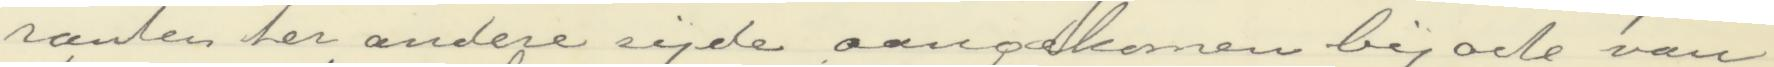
ranten ter andere zijde aangekomen bij acte van
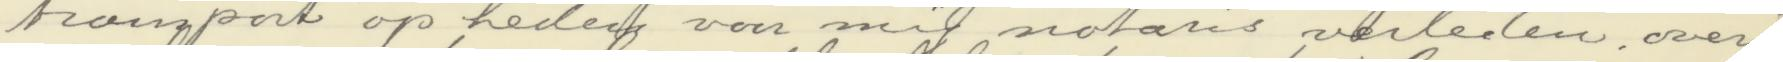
transport op heden voor mij notaris verleden, over
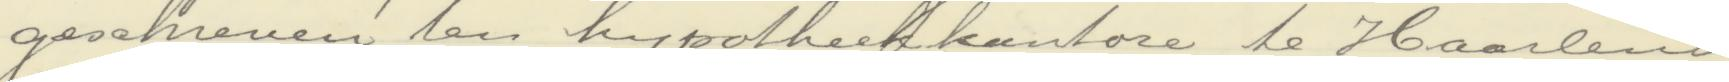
geschreven ten hypotheekkantore te Haarlem
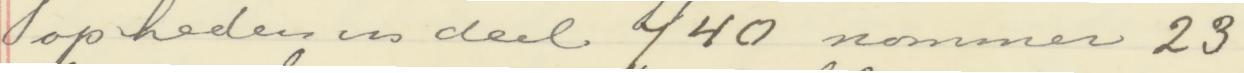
op heden is deel 740 nommer 23
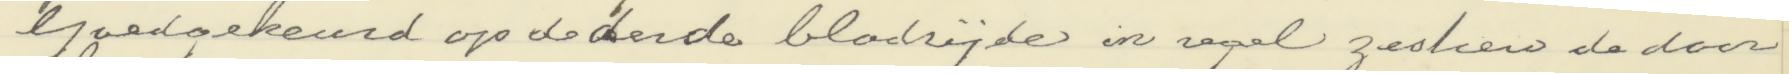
Goedgekeurd op de derde bladzijde in regel zestien de door
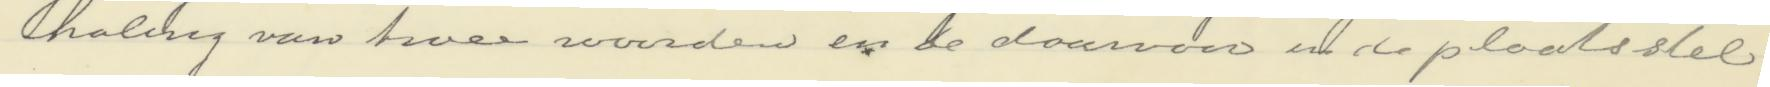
haling van twee woorden en de daarvoor in de plaatsstel
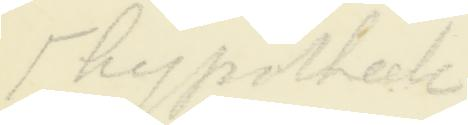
¶ hypotheek
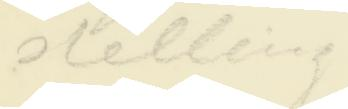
stelling
